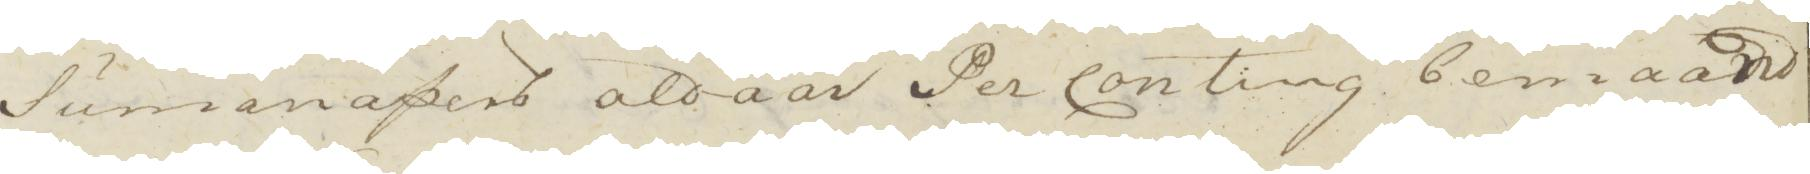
Sumanapers aldaar Per Conting bemaand
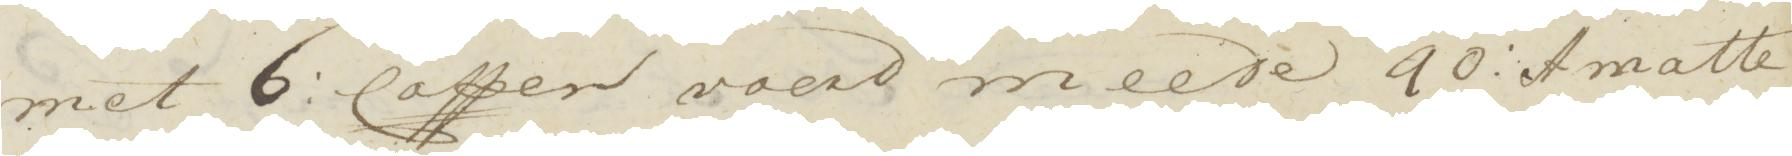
met 6: Coppen voerd meede 40: Amatte
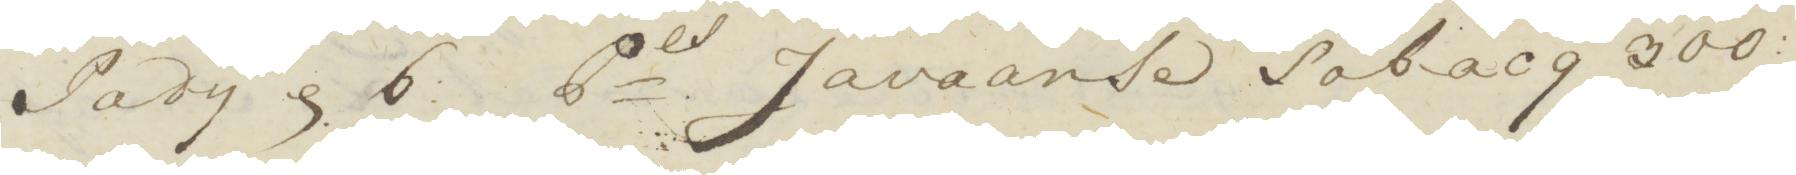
Padij en 6: P=ls. Javaanse Tobacq 300:
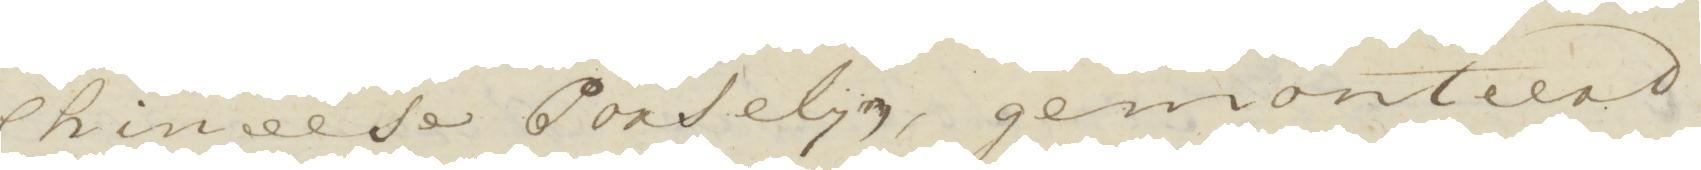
Chineese Porselijn, gemonteerd
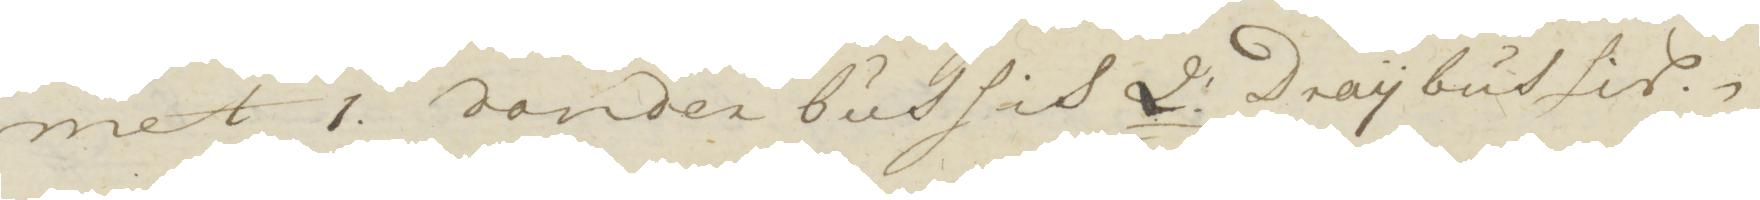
met 1. donder bussis 2: Draijbussis. –
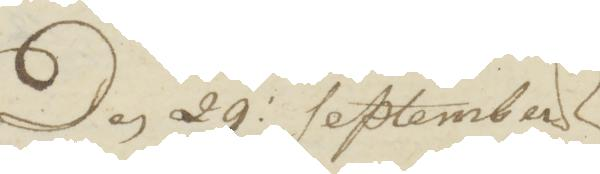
Den 29: september
